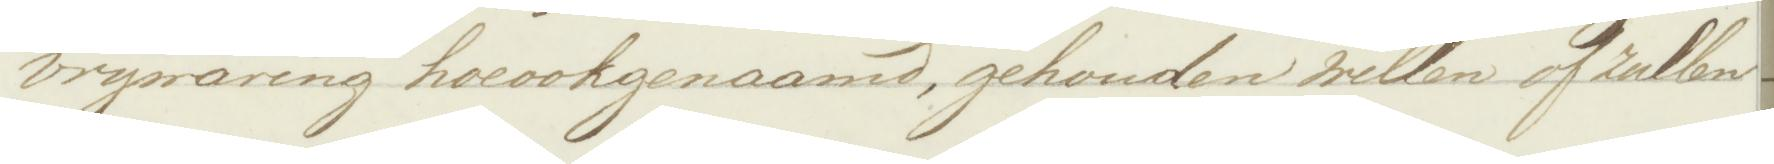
vrijwaring hoeookgenaamd, gehouden willen of zullen
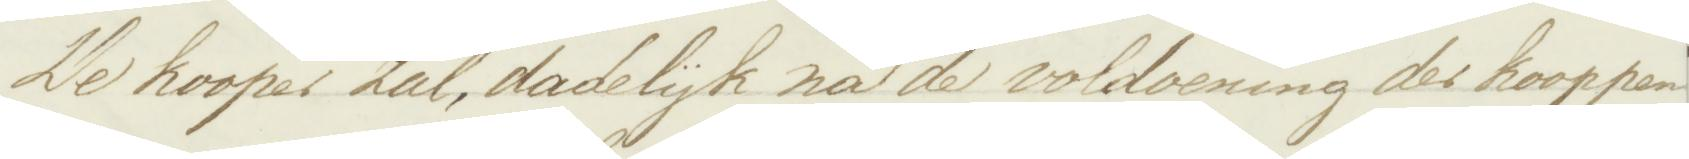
De kooper zal, dadelijk na de voldoening der kooppen
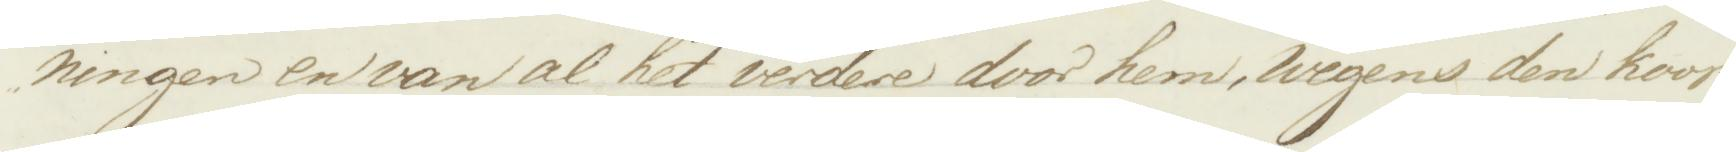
„ningen en van al het verdere door hem, wegens den koop
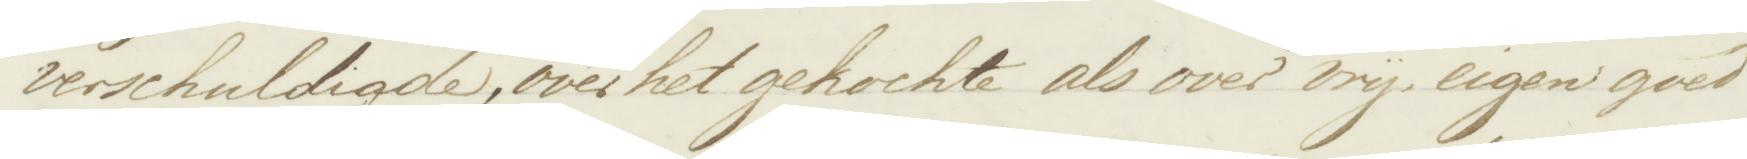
verschuldigde, over het gekochte als over vrij, eigen goed
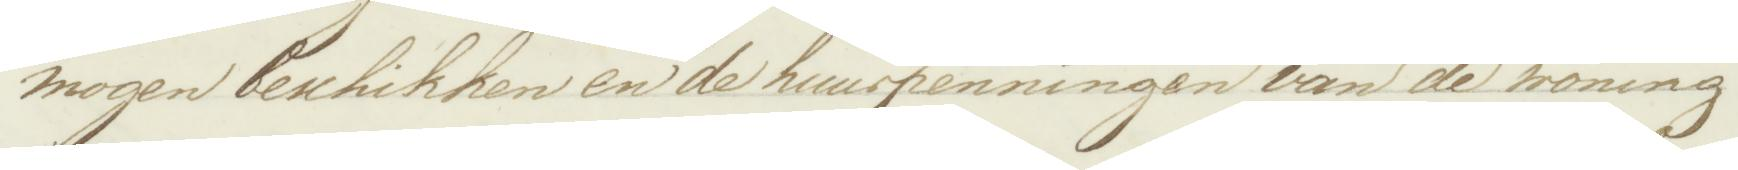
mogen beschikken en de huurpenningen van de woning
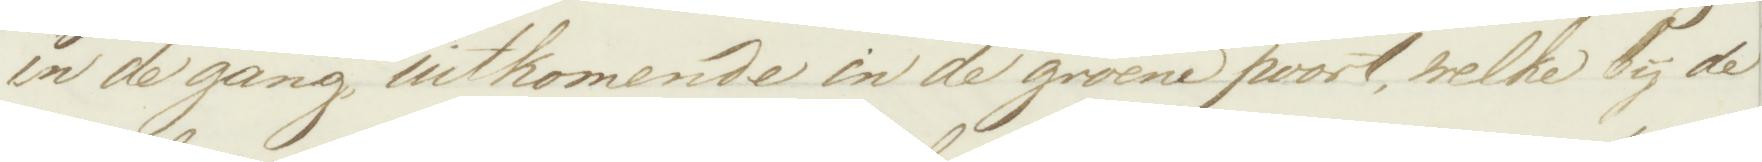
in de gang, uitkomende in de groene poort, welke bij de
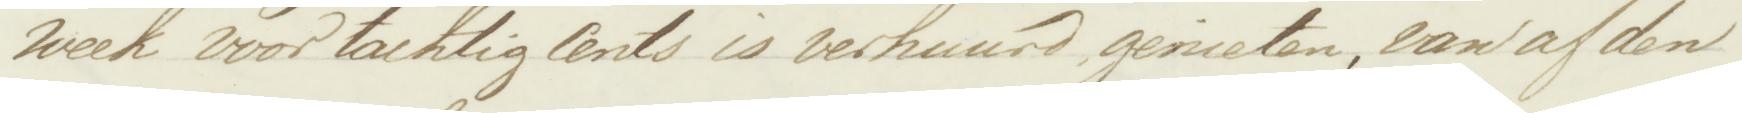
week voor tachtig Cents is verhuurd, genieten, van af den
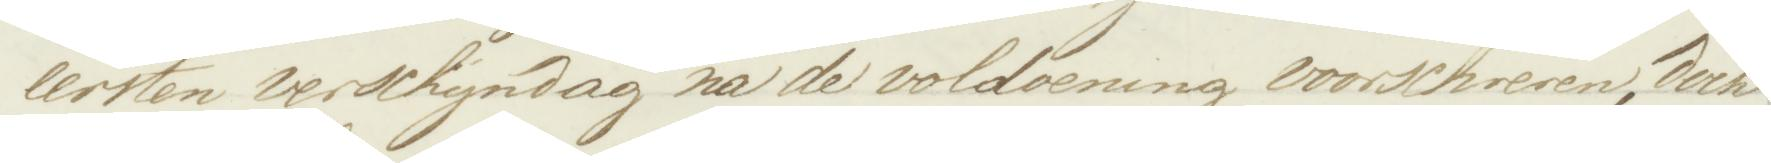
eersten verschijndag na de voldoening voorschreven, doch
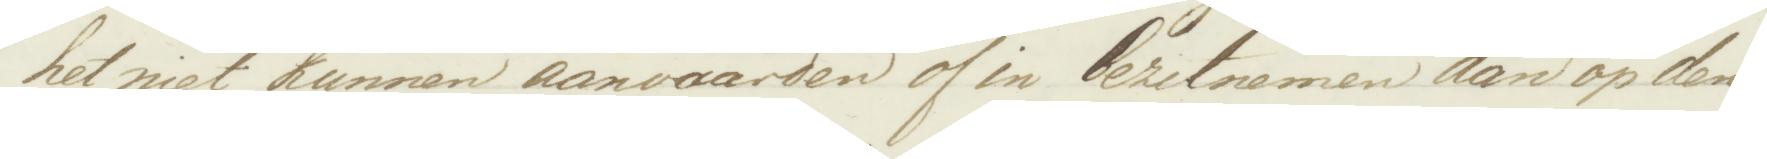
het niet kunnen aanvaarden of in bezitnemen dan op den
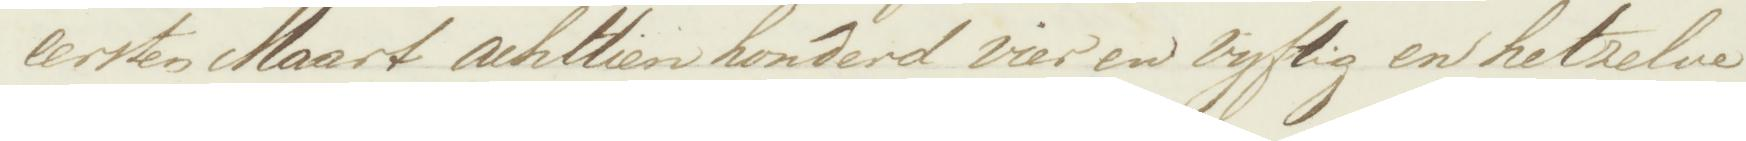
eersten Maart achttien honderd vier en vijftig en hetzelve
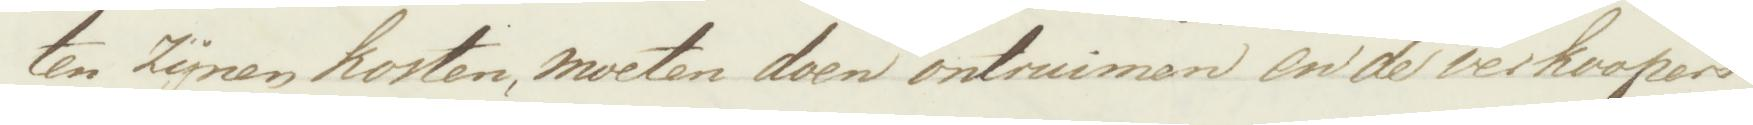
ten zijnen kosten, moeten doen ontruimen en de verkoopers
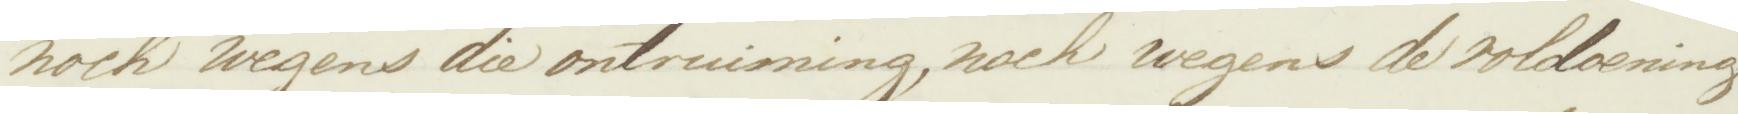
noch wegens die ontruiming, noch wegens de voldoening
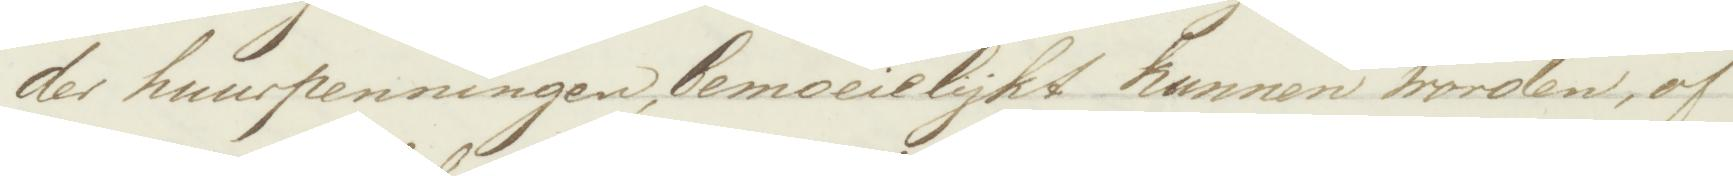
der huurpenningen, bemoeielijkt kunnen worden, of
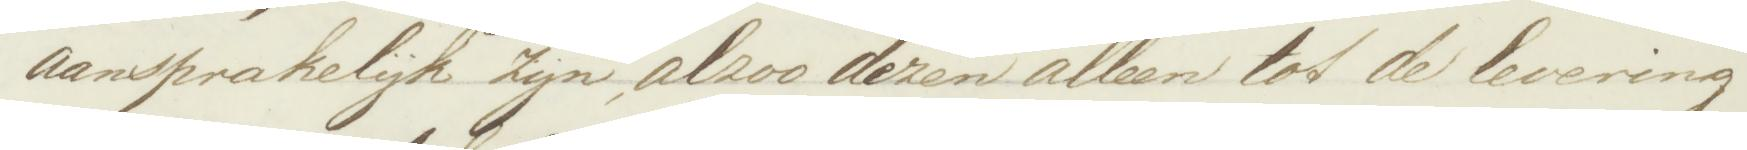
aansprakelijk zijn, alzoo dezen alleen tot de levering
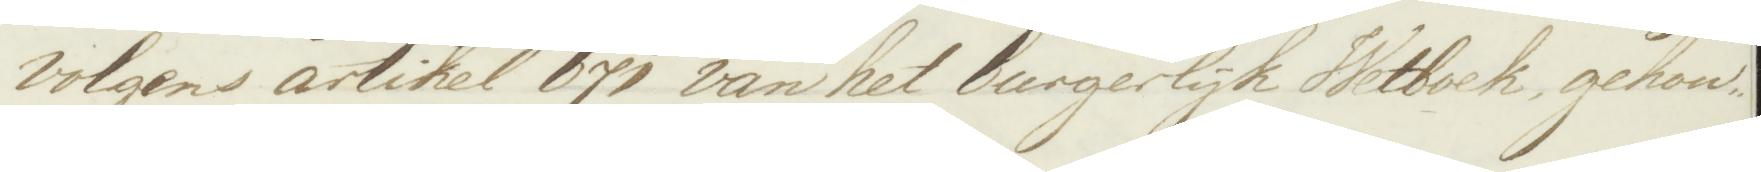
volgens artikel 671 van het burgerlijk Wetboek, gehou„
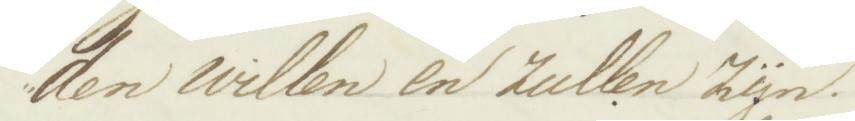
„den willen en zullen zijn.
